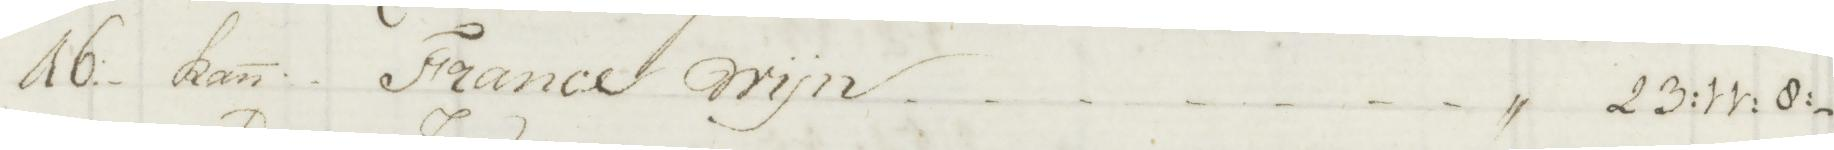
46:- kann:- France wijn - - - - - - - „ 23: 11: 8:-
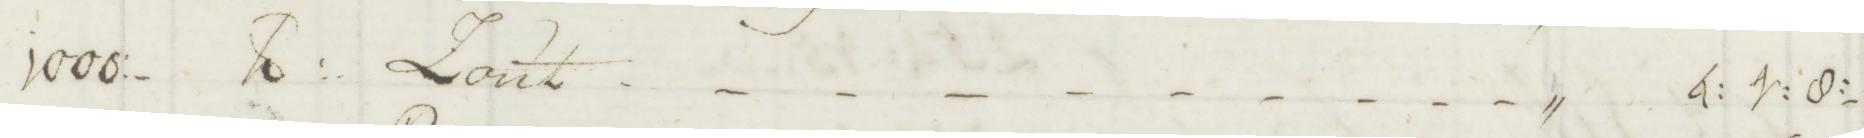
1008:- lb:. Zout - - - - - - - - - - „ 4: 1: 8:-
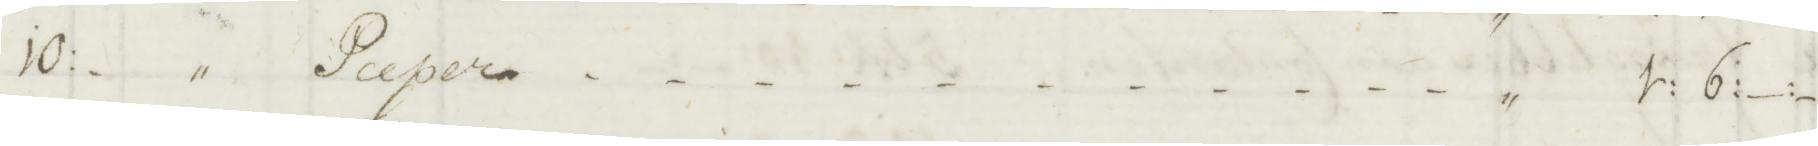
10: - „ Peeper - - - - - - - - - - - „ 1: 6:—:-
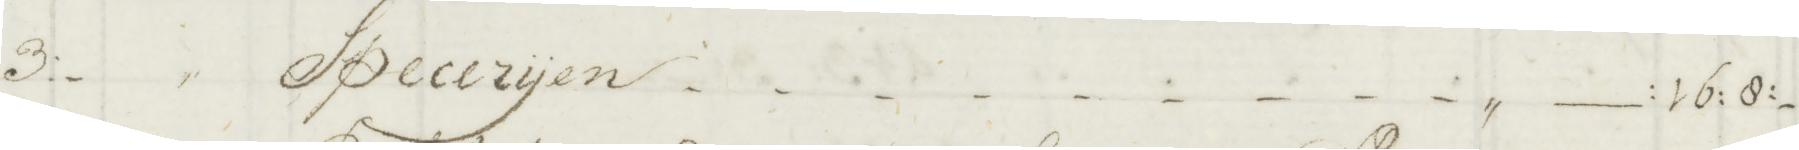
3: - „ Specerijen - - - - - - - - - „ —: 16: 8:-
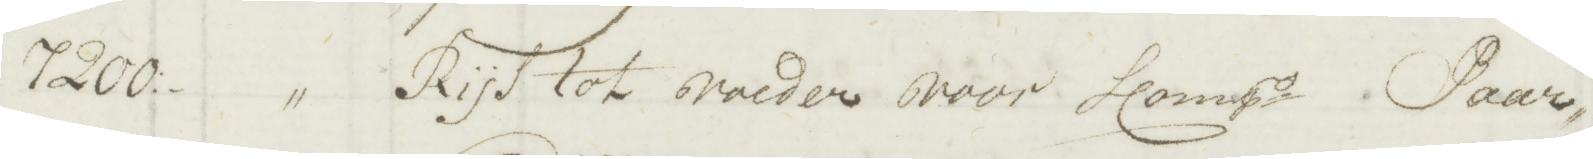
7200:- „ Rijs tot voeder voor sComp=s Paar„
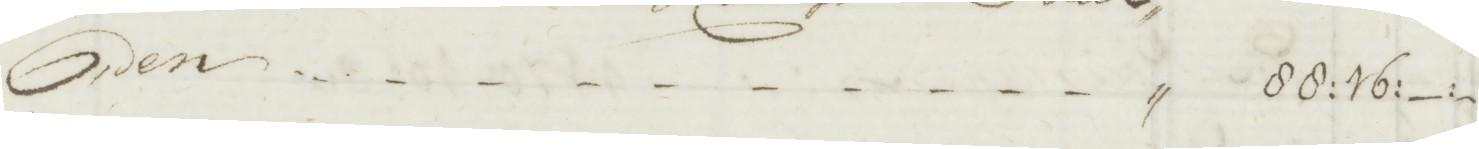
,den - - . - - - - - - - - - „ 88: 16:—:-
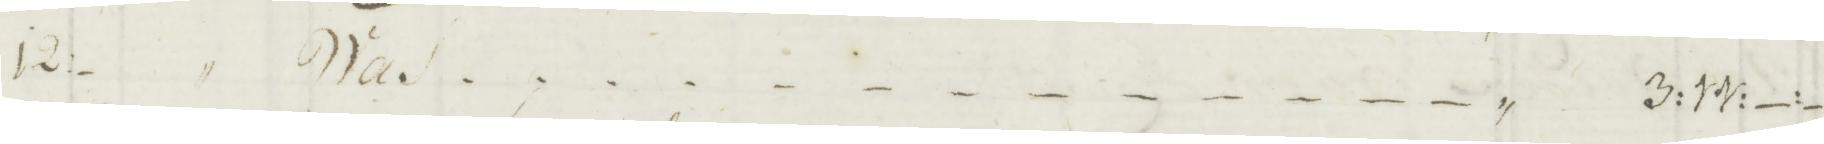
12:- „ Was - - - - - - - - - - - - - „ 3: 11:—:-
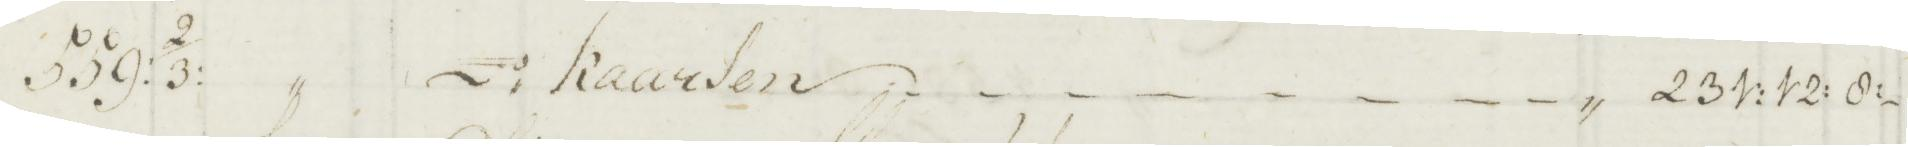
559:2/3: „ d:o kaarsen - - - - - - - „ 231: 12: 8:
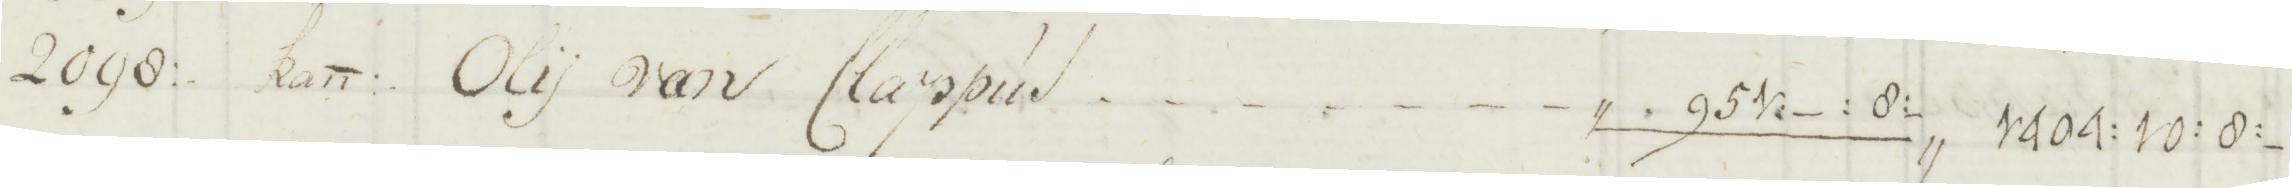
2098:- kann: Olij van Clappus - - - - - - - „ 951:—: 8:- „ 1404: 10: 8:-
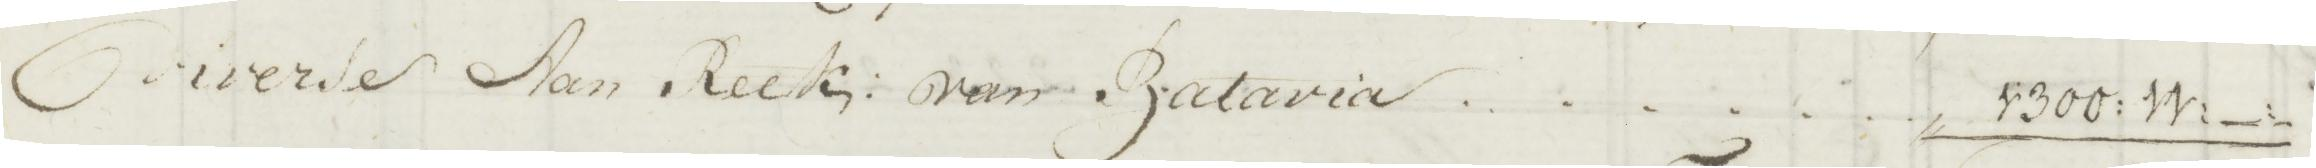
diverse Aan Reek: van Batavia . . . . . . . „ 1300: 11:—:-
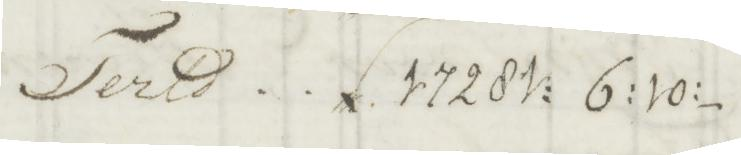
Terld . . ƒ. 17281: 6: 10:-
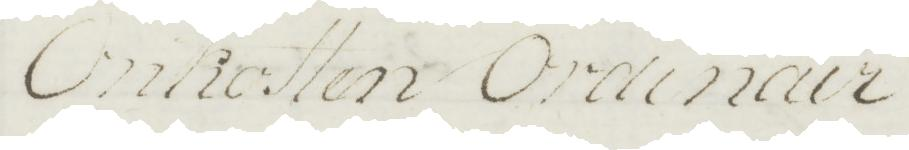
Onkosten Ordinair
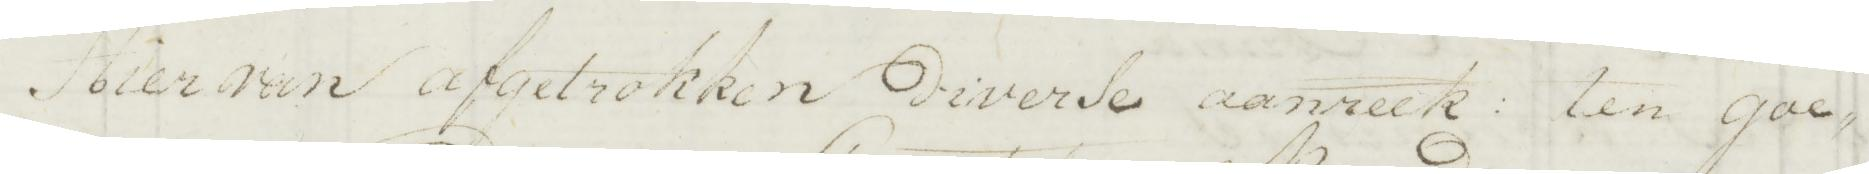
Hier van afgetrokken diverse aanreek: ten goe„
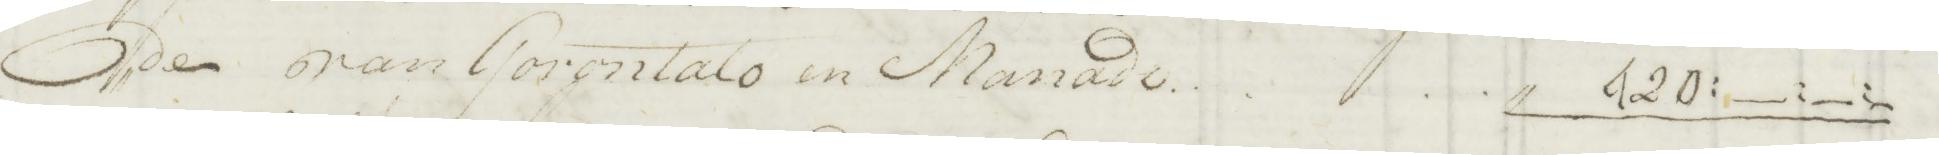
de van Gorentalo en Manado. . . . . „ 420:—:—:-
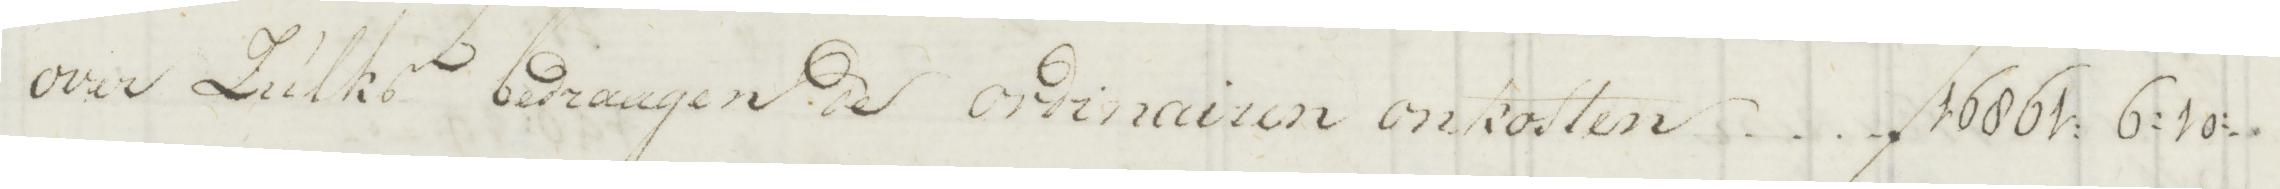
over zulks bedraagen de ordinairen onkosten . . . . ƒ16861: 6: 10:-
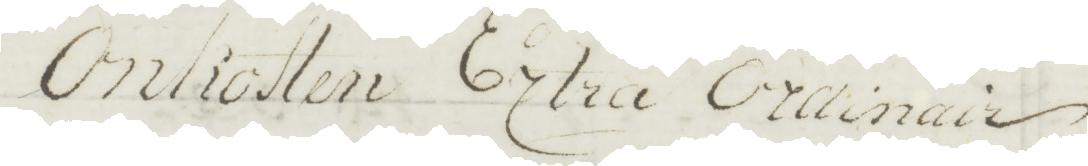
Onkosten Extra Ordinair
